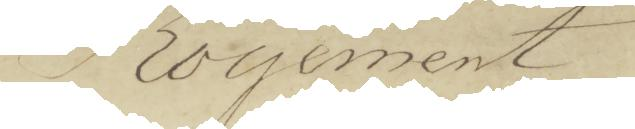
Royement
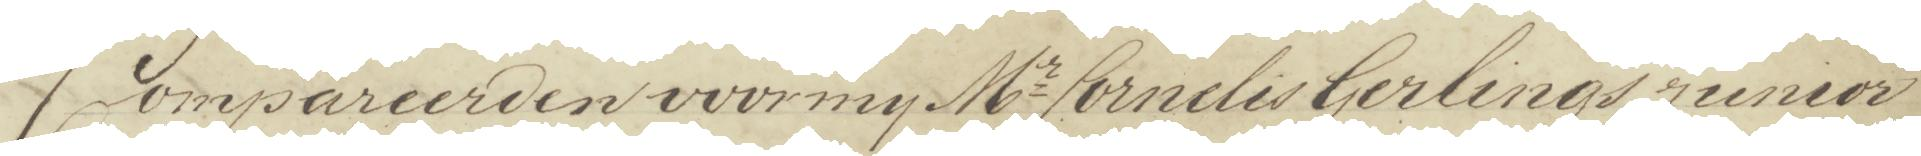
Compareerden voor my M=r Cornelis Gerlings junior
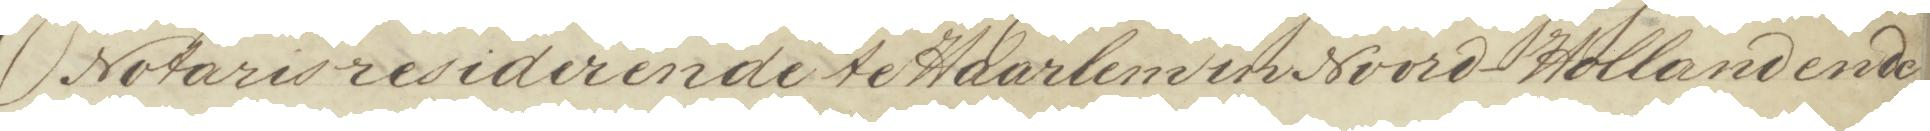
Notaris residerende te Haarlem in Noord-Holland ende
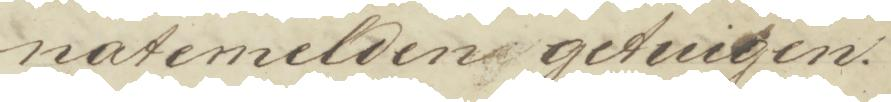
natemeldene getuigen.
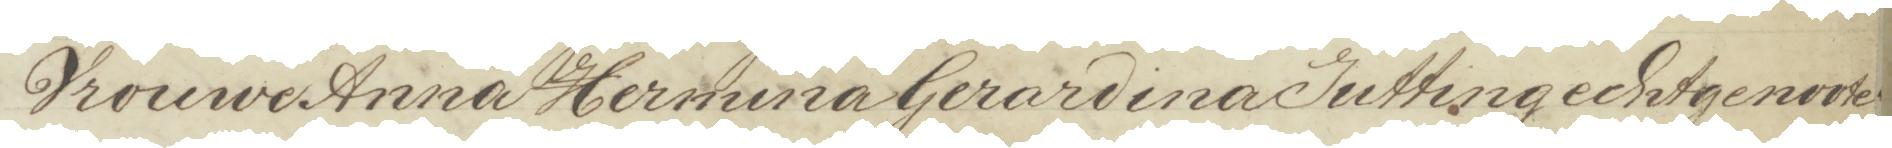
Vrouwe Anna Hermina Gerardina Iutting echtgenoote
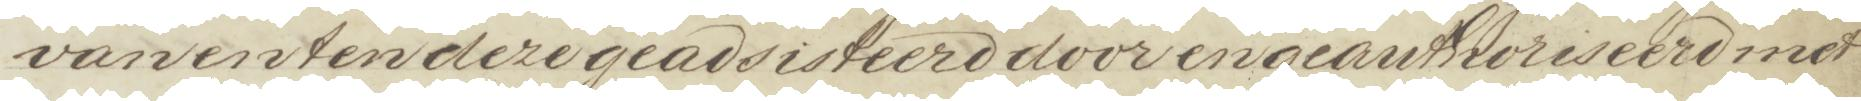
van en ten deze geadsisteerd door en geauthoriseerd met
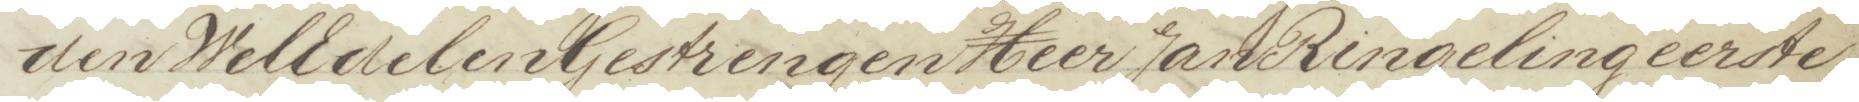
den WelEdelen Gestrengen Heer Jan Ringeling eerste
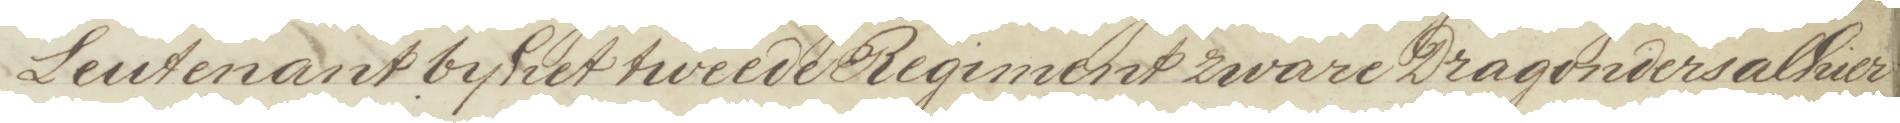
Leutenant by het tweede Regiment zware Dragonders alhier
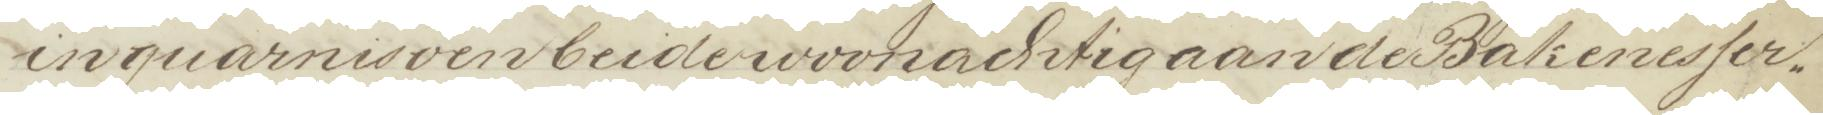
in guarnisoen beide woonachtig aan de Bakenesser„
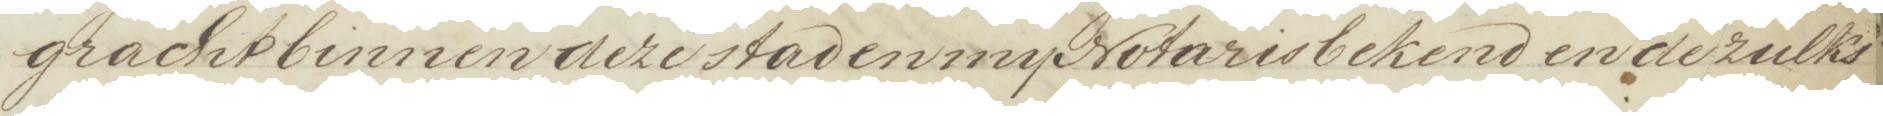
gracht binnen deze stad en my Notaris bekend en de zulks
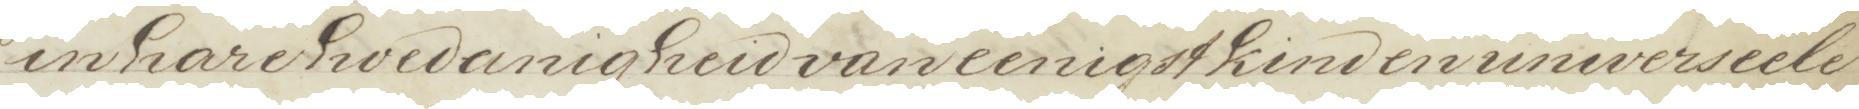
in hare hoedanigheid van eenigst kind en universeele
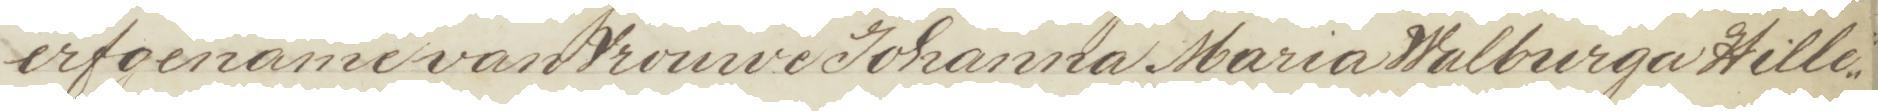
erfgename van Vrouwe Iohanna Maria Walburga Hille„
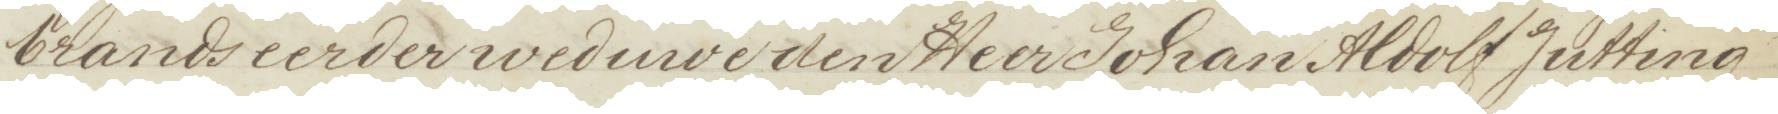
brands eerder weduwe den Heer Iohan Aldolf Jutting
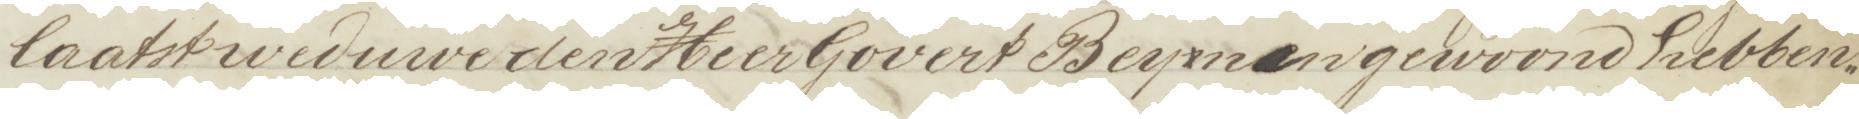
laatst weduwe den Heer Govert Beymen gewoond hebben„
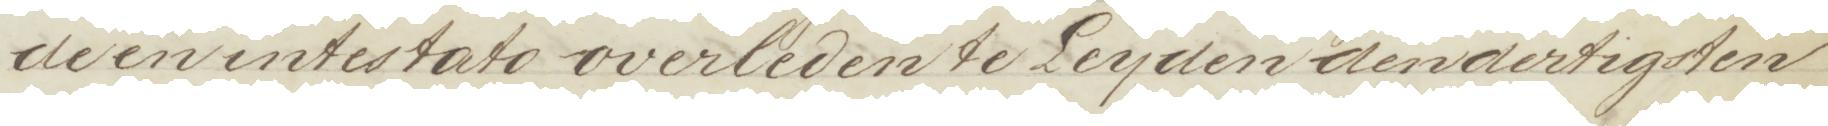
de en intestato overleden te Leyden den dertigsten
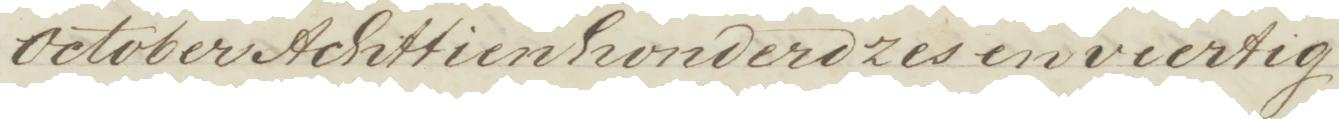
October Achttien honderd zes en veertig
